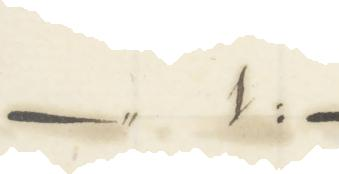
— „1: —
